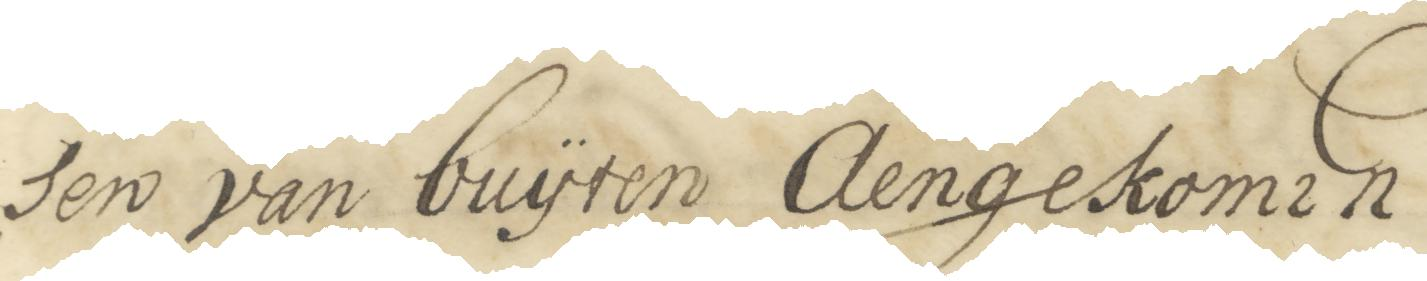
sen van buijten Aengekomen
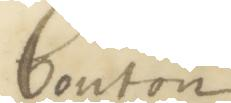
bonton
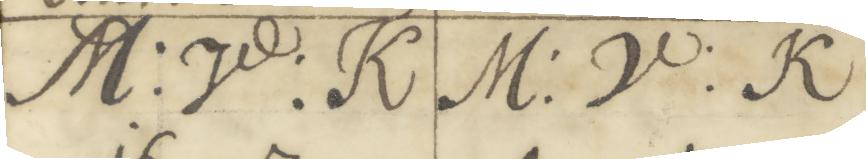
M:V:K M:V:K
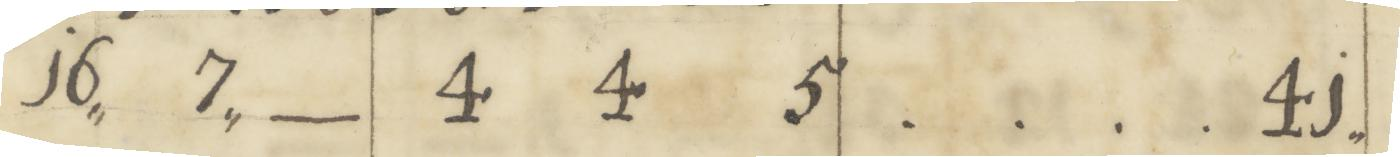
16„ 7„ — 4 4 5 . . . . 41„
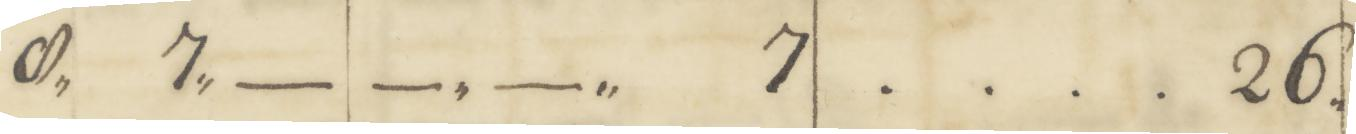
8„ 7„ — — „ — „ 7 . . . . 26„
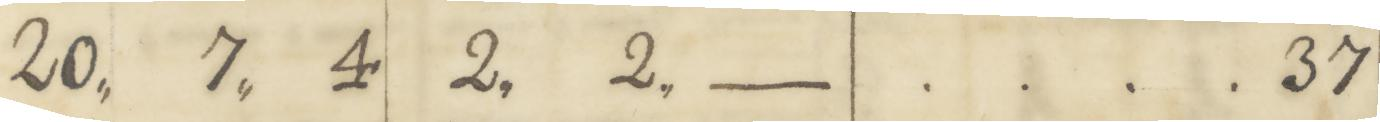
20„ 7„ 4 2„ 2„ — . . . . 37
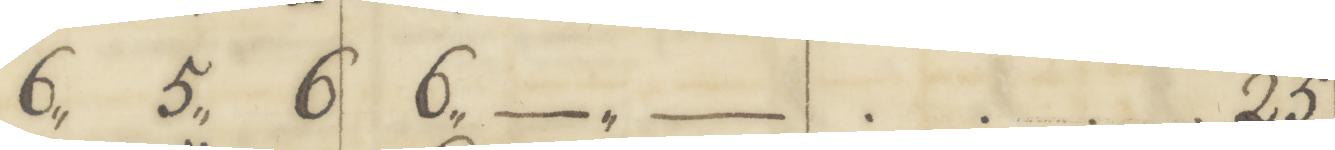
6„ 5„ 6 6„ —„ — . . . . 25
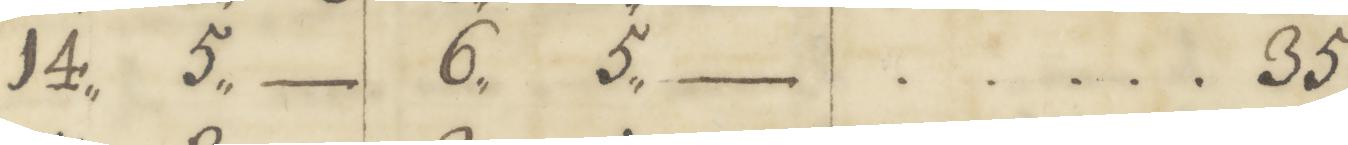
14„ 5„ — 6„ 5„ — . . . . . 35
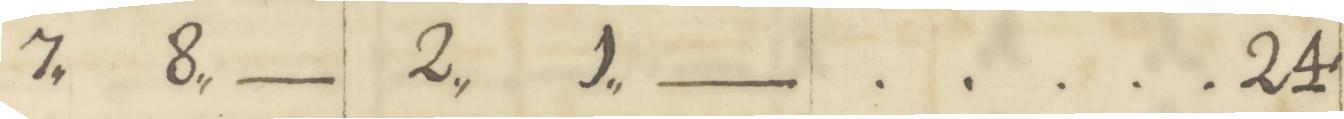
7„ 8„ — 2„ 1„ — . . . . . 24
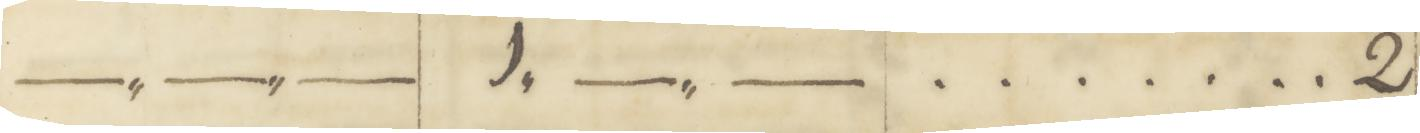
—„ —„ — 1„ —„ — . . . . . . . 2
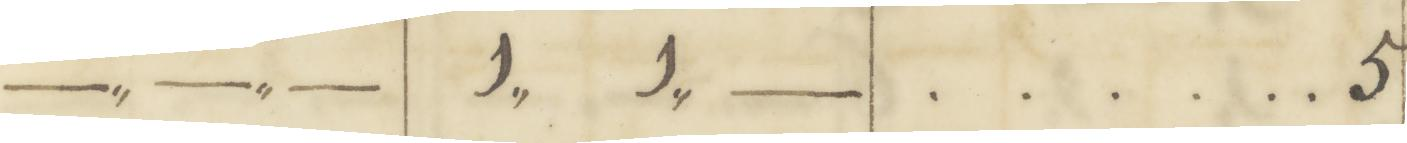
—„ —„ — 1„ 1„ — . . . . . . 5
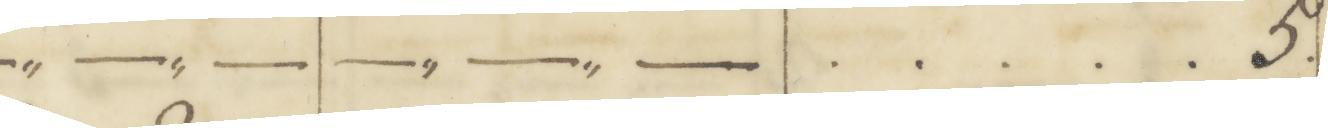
„ —„ — —„ —„ — . . . . . 5.
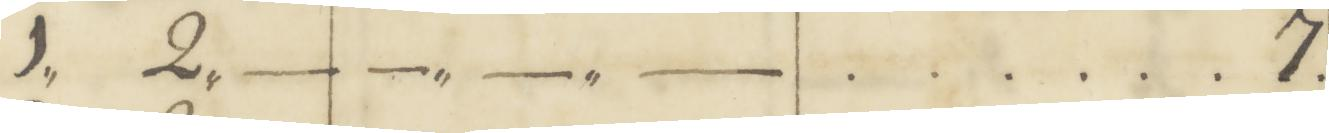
1„ 2„ — —„ —„ — . . . . . . 7
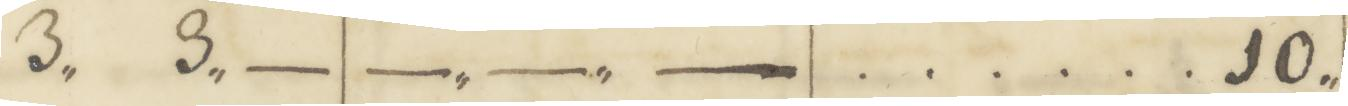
3„ 3„ — —„ —„ — . . . . . . 10„
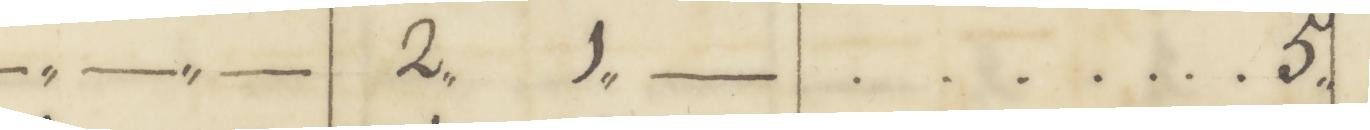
—„ —„ — 2„ 1„ — . . . . . . . 5„
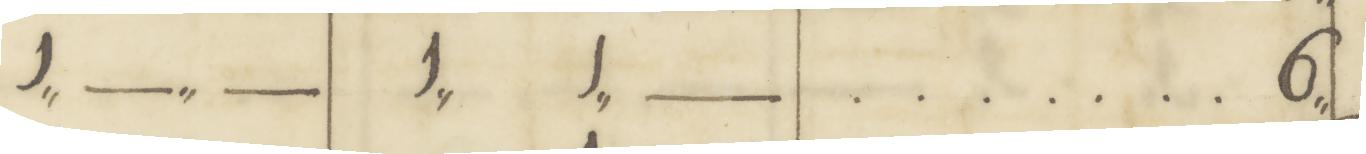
1„ —„ — 1„ 1„ — . . . . . . . 6„
